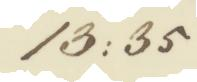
13:35
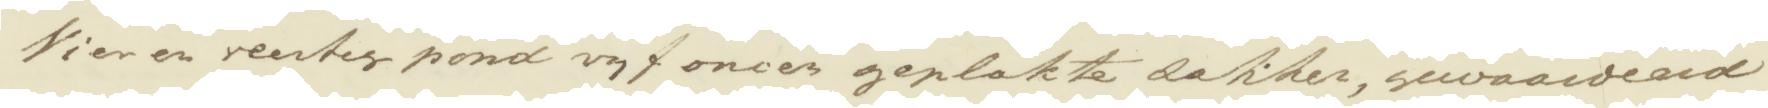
Vier en veertig pond vyf oncen geplakte zakken, gewaardeerd
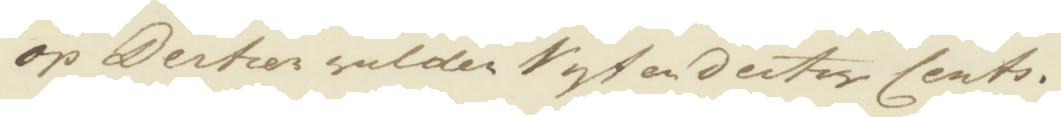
op Dertien gulden Vyf en dertig Cents.
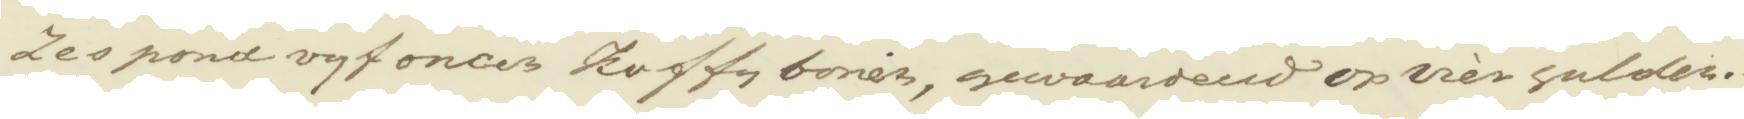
Zes pond vyf oncen Koffy bonen, gewaardeerd op vier gulden.
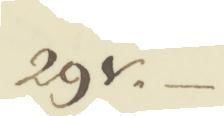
291„ —
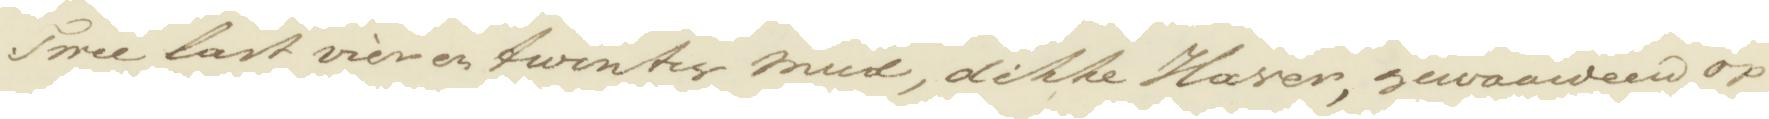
Twee last vier en twintig mud, dikke Haver, gewaardeerd op
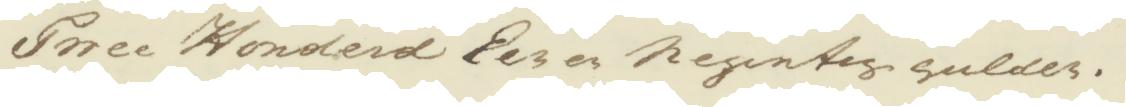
Twee Honderd Een en Negentig gulden.
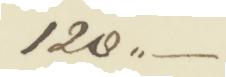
128 „—
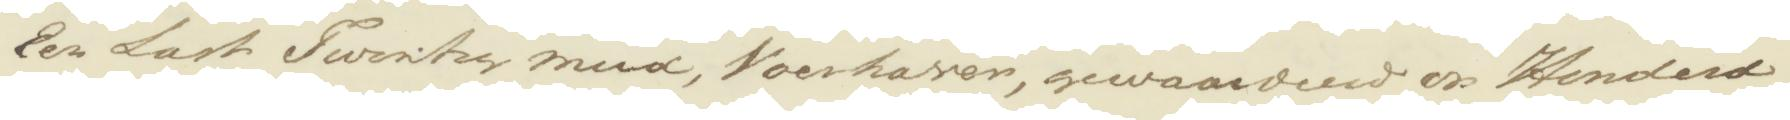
Een Last Twintig mud, Voerhaver, gewaardeerd op Honderd
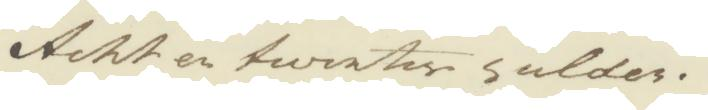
Acht en twintig gulden.
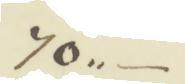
70„—
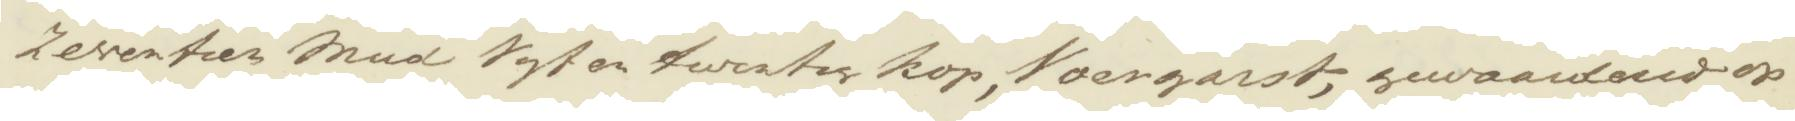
Zeventien mud vyf en twintig kop, Voergarst, gewaardeerd op
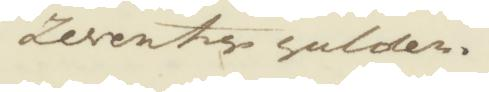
zeventig gulden.
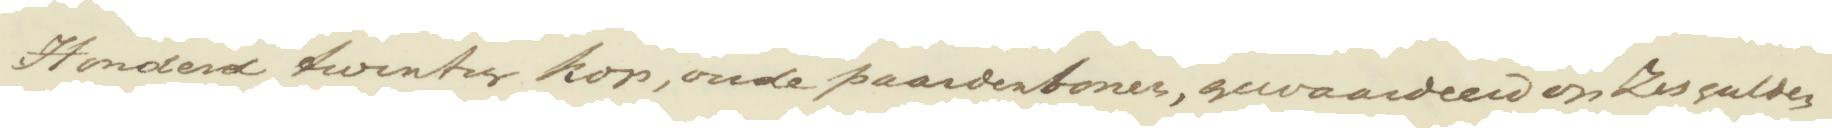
Honderd twintig kop, oude paardenbonen, gewaardeerd op Zes gulden
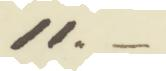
11.—
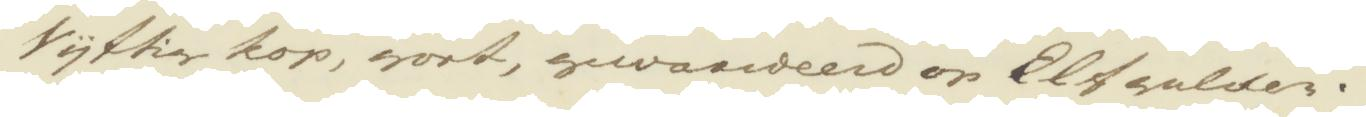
Vijftig kop, gort, gewaardeerd op Elf gulden.
